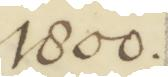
1800.
